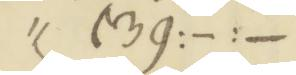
„ 539:—:—
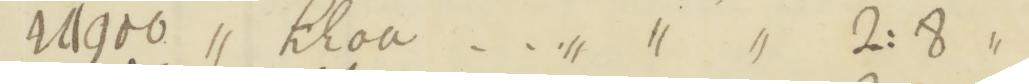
44900. „ khoa - - „ „ „ 2:8 „
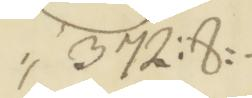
„ 372:8:
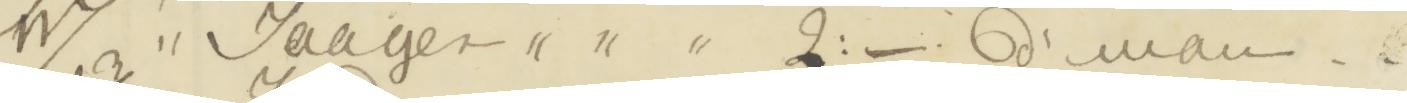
117„ Iaager „ „ „ 2:—:d' man . .
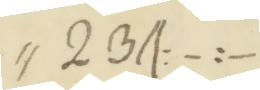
„ 234:—:—
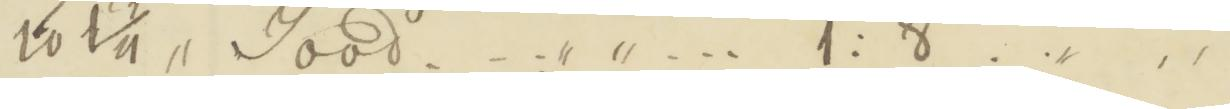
101¾ „ Iood - - - „ „ - - - 1: 8 . „ .
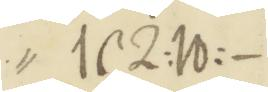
„ 152:10:—
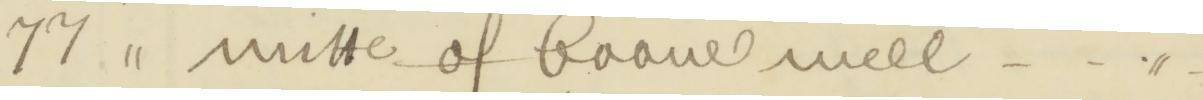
77 „ witte of boone meel - - „
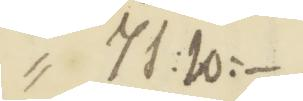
„ 71:10:—
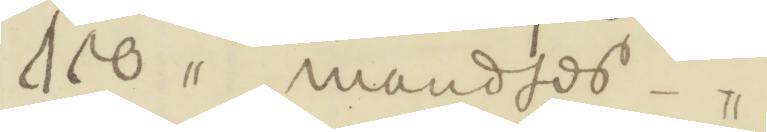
450 „ mandjes - „
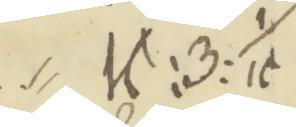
ƒ 15:3: 1/15
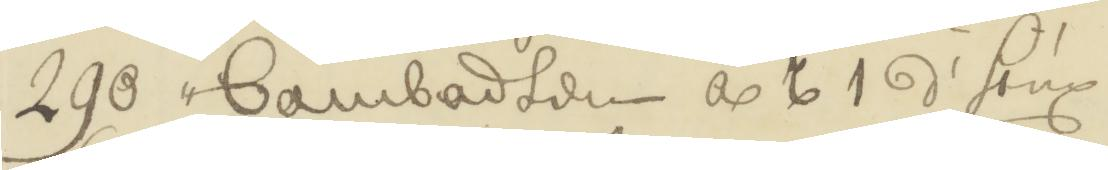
290 „ bambaesen a r 1 d’ stux
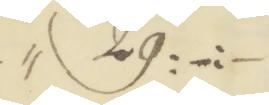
„ 29: —:—
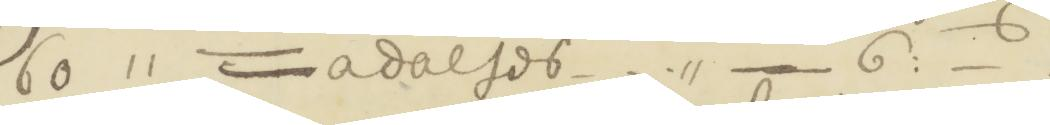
60 „ Cadaljes - - - „ — 6:—
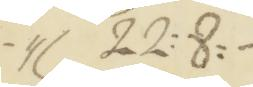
„ 22:8:—
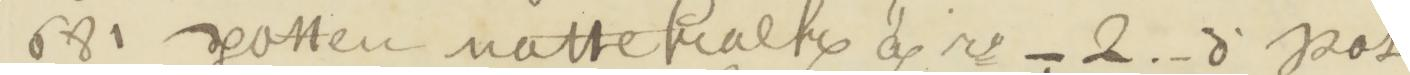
681 potten natte kalk â r:o — 2.–d' pot
